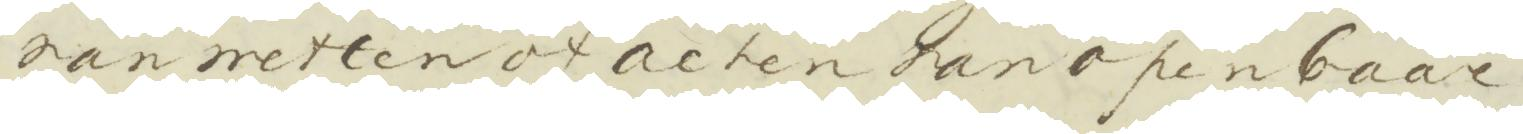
van wetten of acten van openbaar
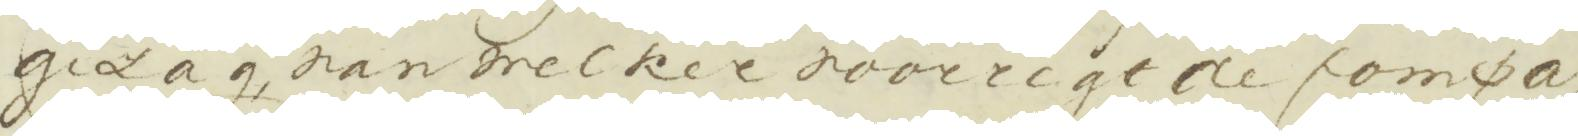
gezag, van welker voorregt de Compa
